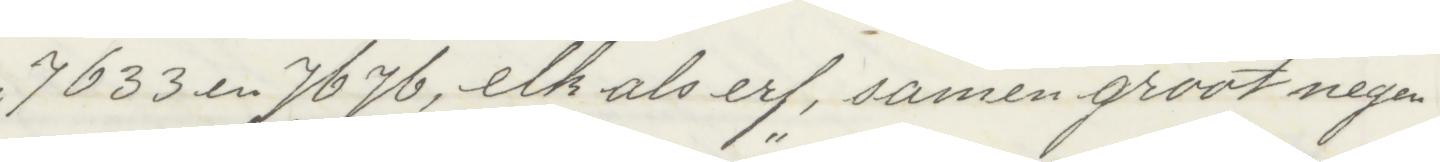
7633 en 7676, elk als erf, samen groot negen
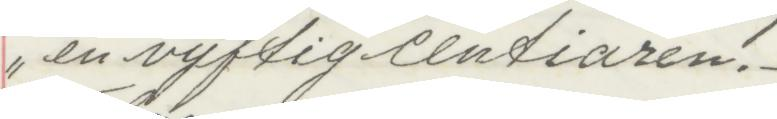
„en vijftig centiaren.
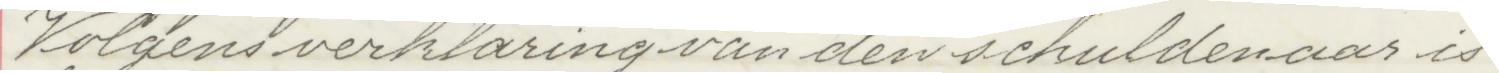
Volgens verklaring van den schuldenaar is
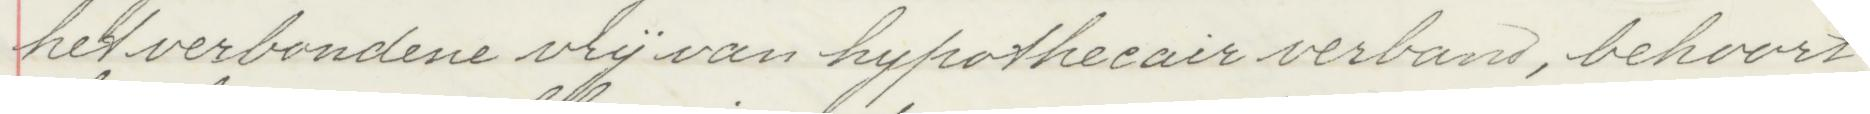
het verbondene vrij van hypothecair verband, behoort
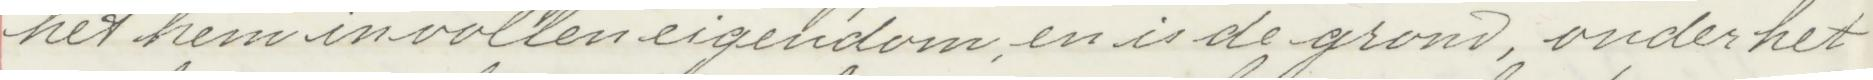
het hem in vollen eigendom, en is de grond onder het
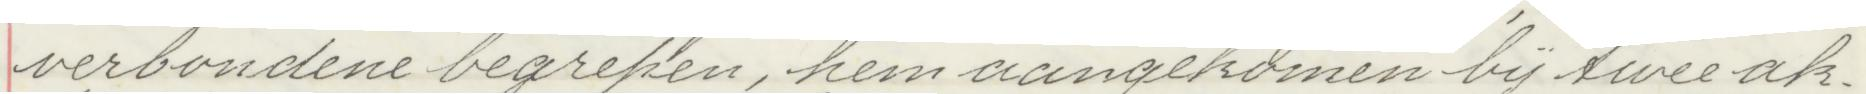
verbondene begrepen, hem aangekomen bij twee ak-
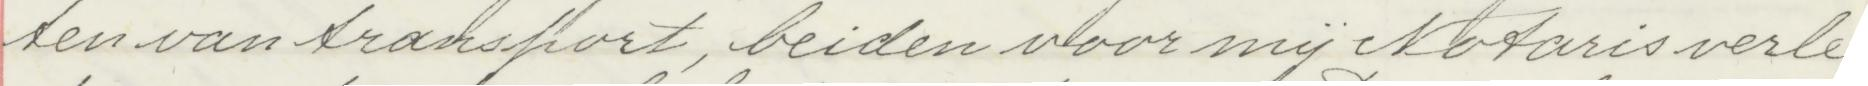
ten van transport, beiden voor mij Notaris verle
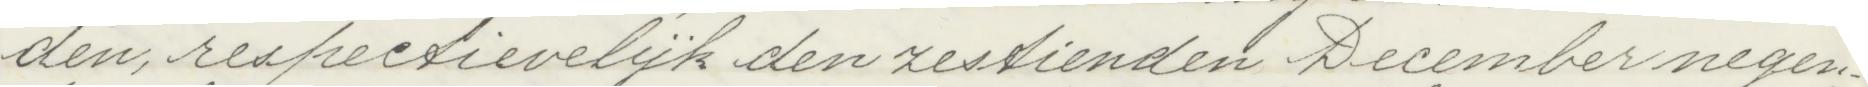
den, respectievelijk den zestienden December negen
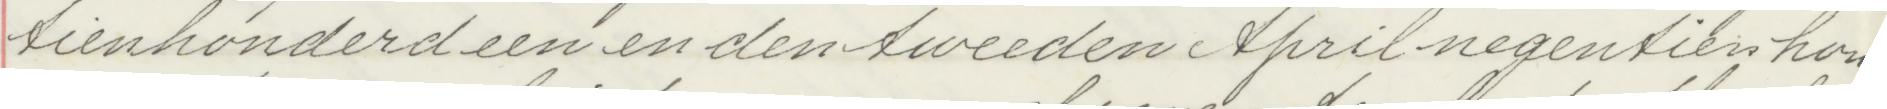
tienhonderd een en den tweeden April negentien hon.
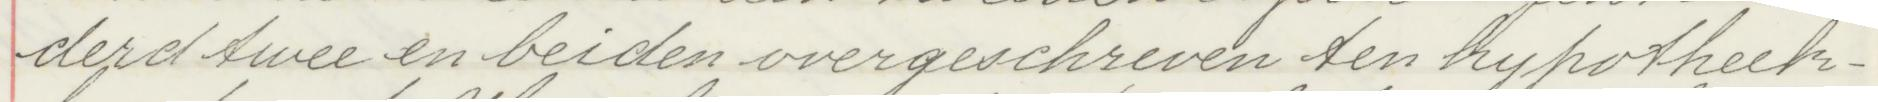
derd twee en beiden overgeschreven ten hypotheek-
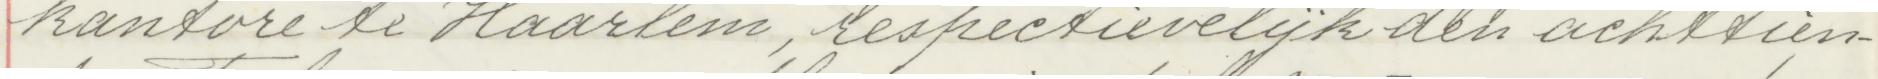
kantore te Haarlem, respectievelijk den achttien-
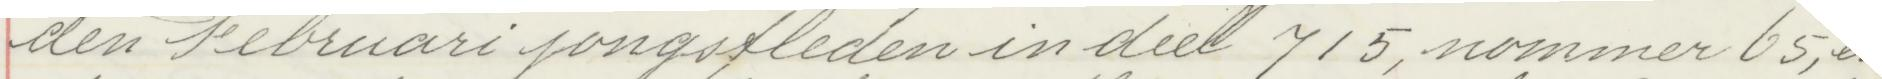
den Februari jongstleden in deel 715, nommer 65, en
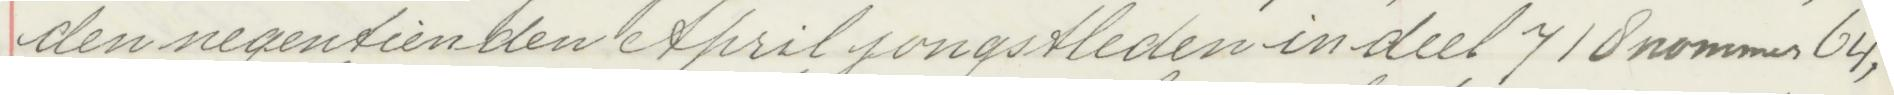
den negentienden April jongstleden in deel 718 nommer 64,
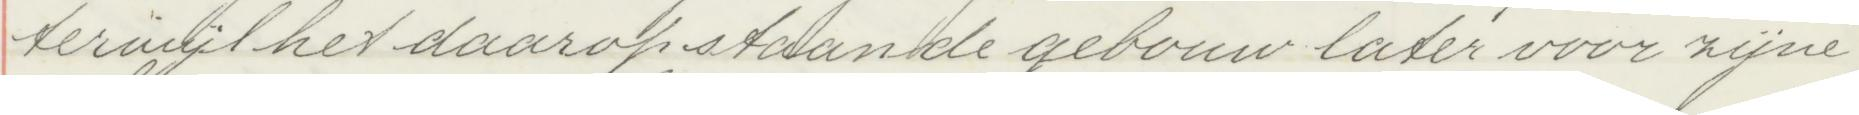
terwijl het daaropstaande gebouw later voor zijne
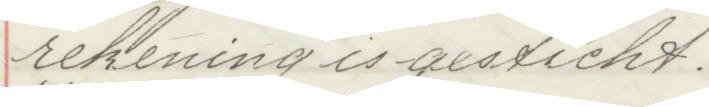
rekening is gesticht.
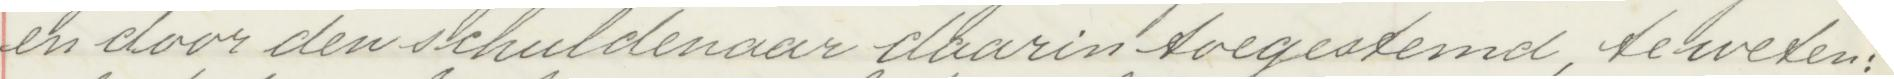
en door den schuldenaar daarin toegestemd, te weten:
